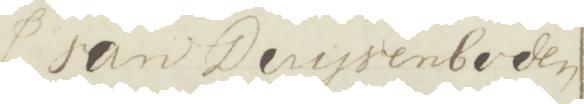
J. van Duyvenboden
